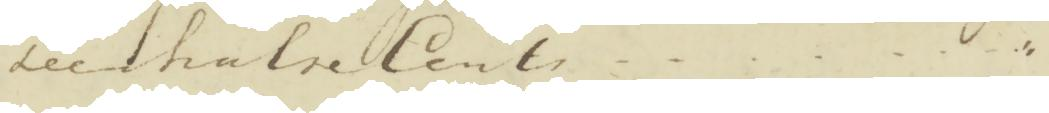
& een halve Cents - - - - - - „
